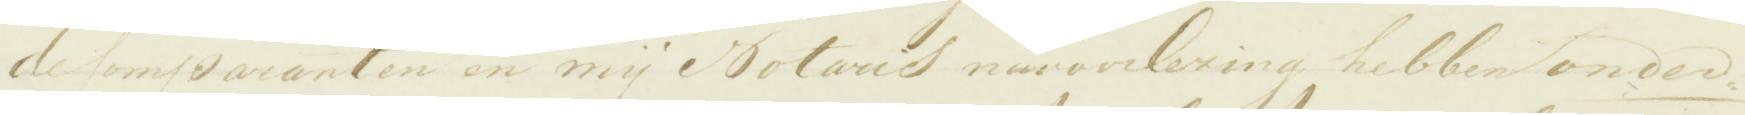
de Comparanten en mij Notaris navoorlezing hebben onder=
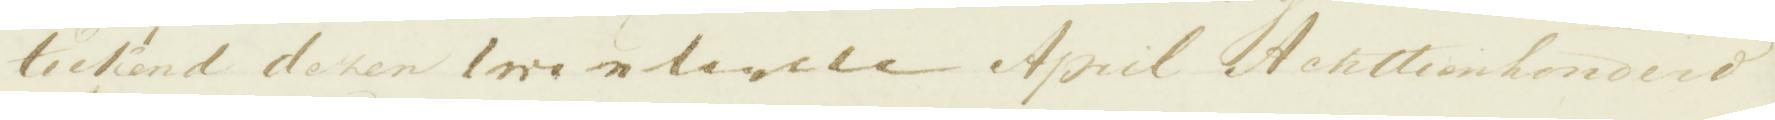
teekend dezen twintigste April Achttienhonderd
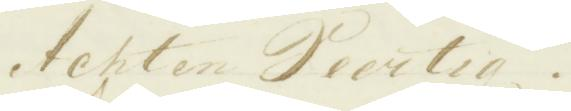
Achten Veertig .
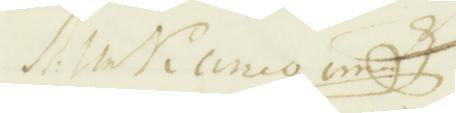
A van Kanegom
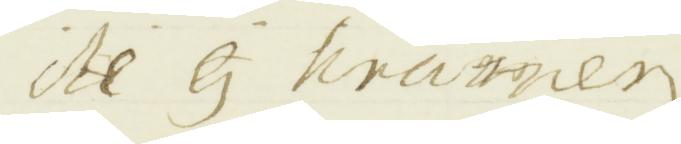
Al G kramer
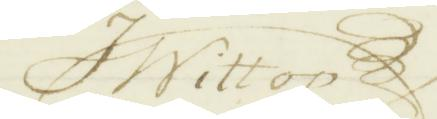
J Wittop
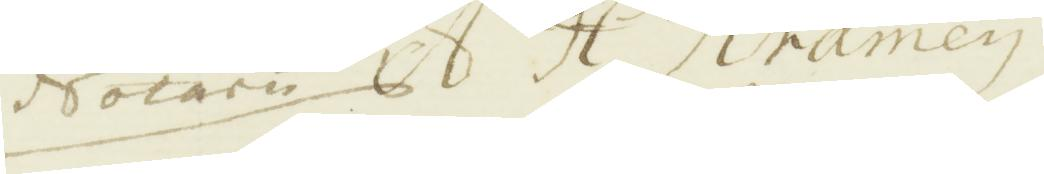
Notaris A H Kramen
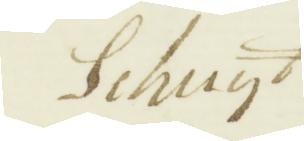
G Schuyt
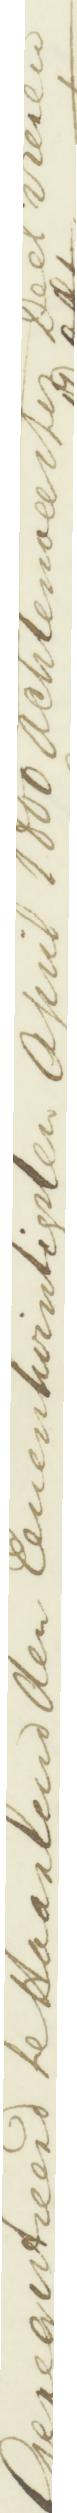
Geregistreerd te Haarlem den Eenentwintigsten April 1800 achtenveertig Deel vieren
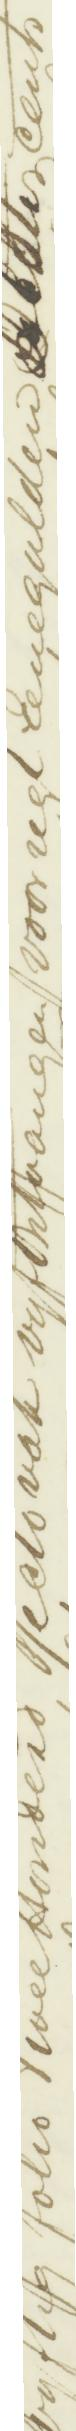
vyftig folio Twee Honderd recto vak vyf Ontvangen voor regt Eene gulden DELtien cents
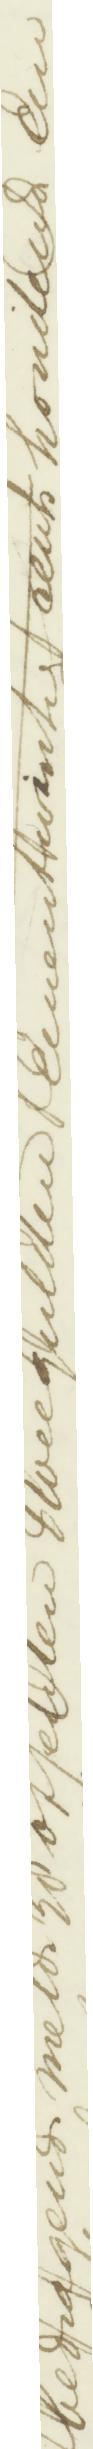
bedragend met de 38 opcenten Twee gulden Eenentwintig cents honderd Een
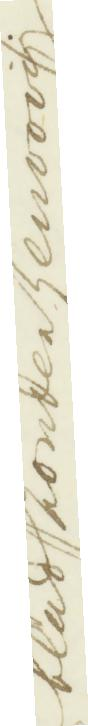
blad zonder renvooij
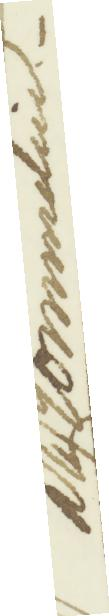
DF Crommelin. –
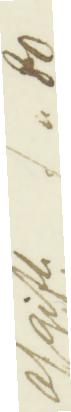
afgift ƒ „ 80
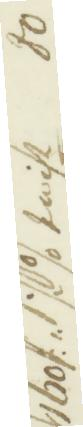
160: „ ½% twist 80
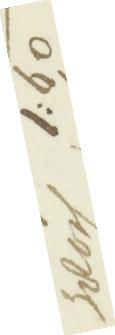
38opC 1:60
